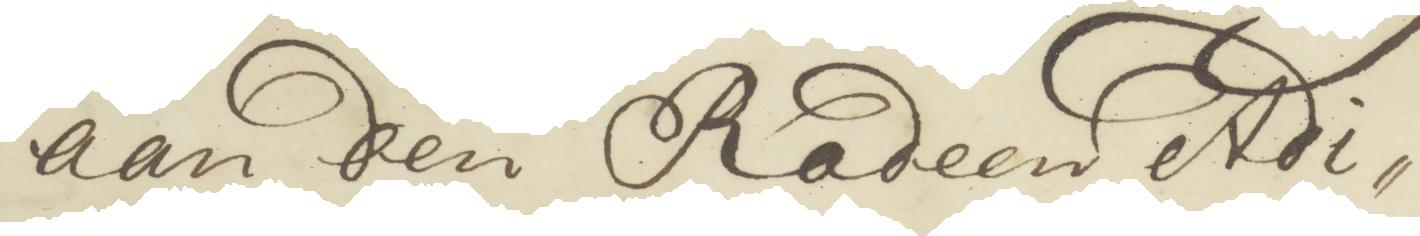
aan den Radeen Adi„
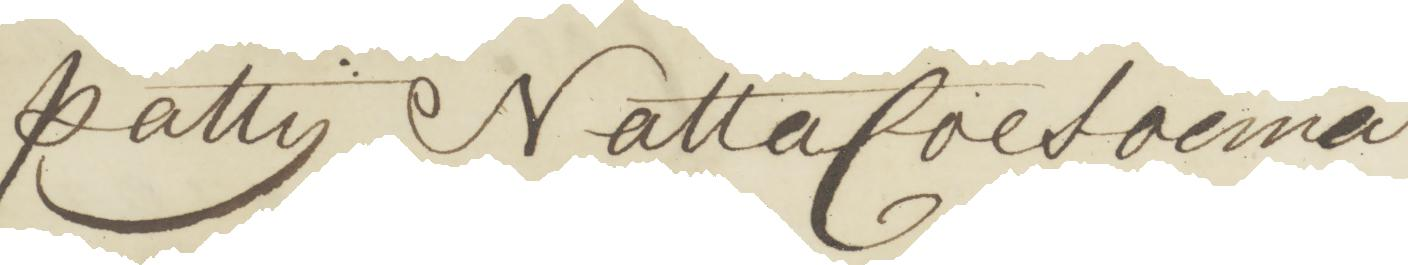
pattij NattaCoesoema
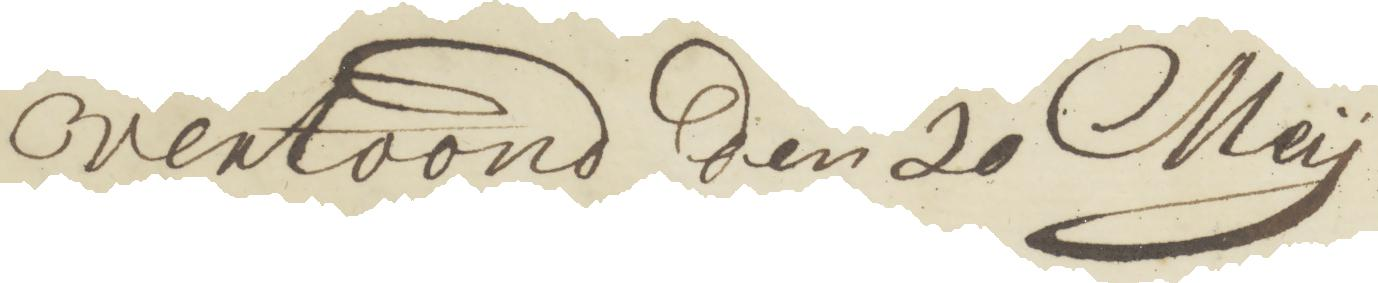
vertoond den 20 Meij
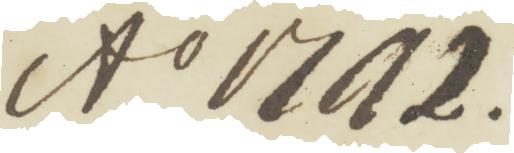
Ao 1742.
